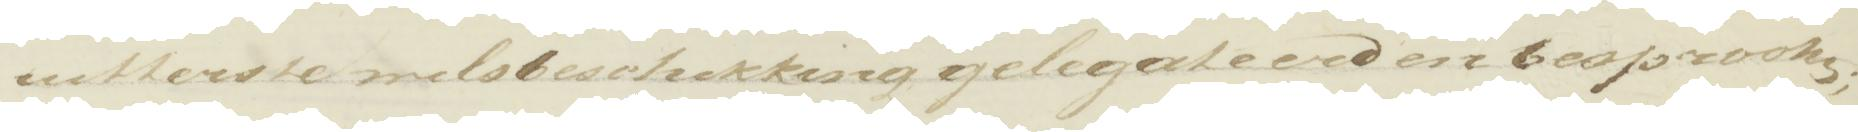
uitters te wils beschikking gelegateerd en besprooken,
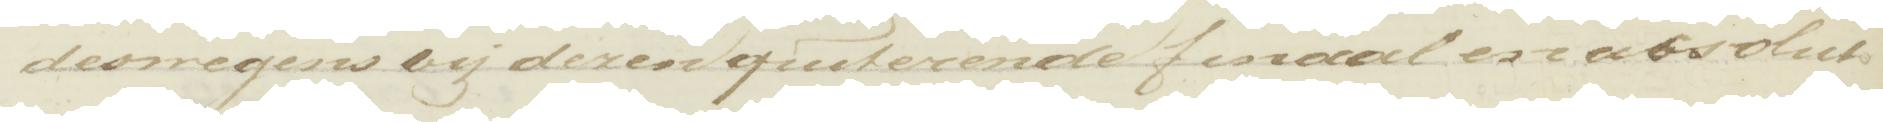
deswegens bij dezen quiterende finaal en absolut
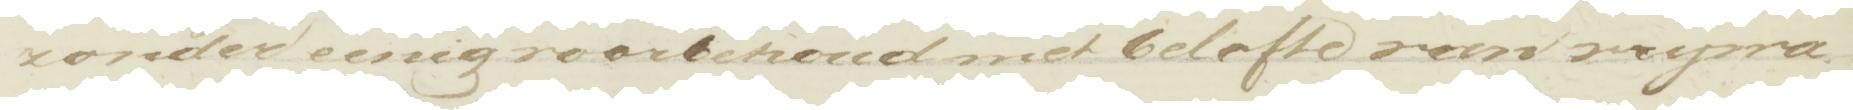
zonder eenig voorbehoud met belofte van vrywa
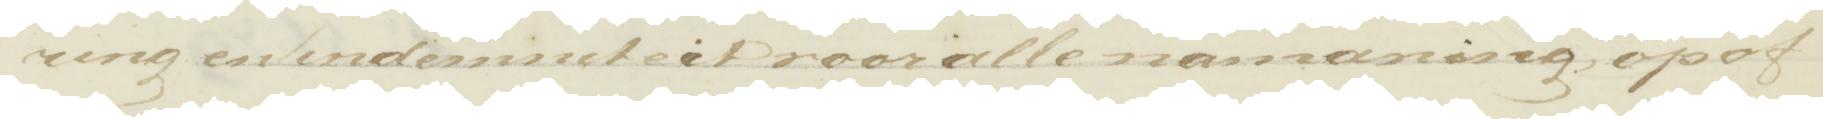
ring en indemniteit voor alle namaning op of
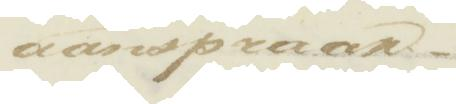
aanspraak
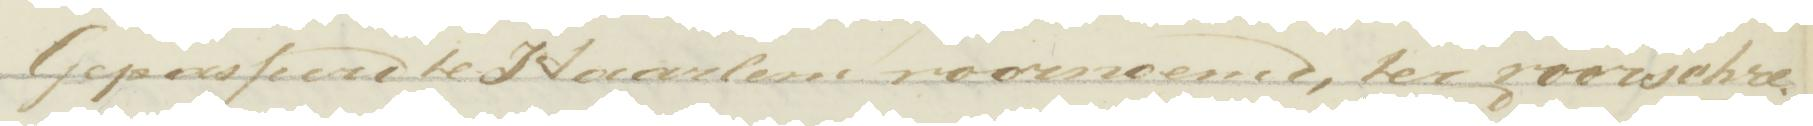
Gepasseerd te Haarlem voornoemd, ter voorschre
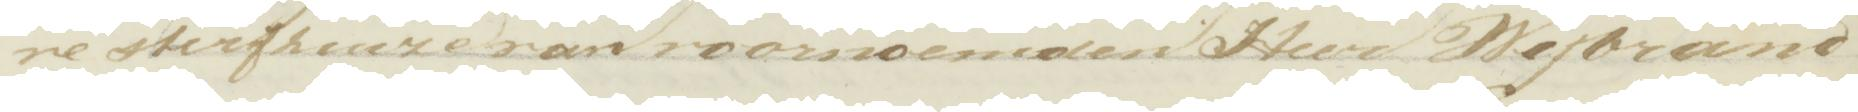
ve sterfhuize van voornoemden Heer Wybrand
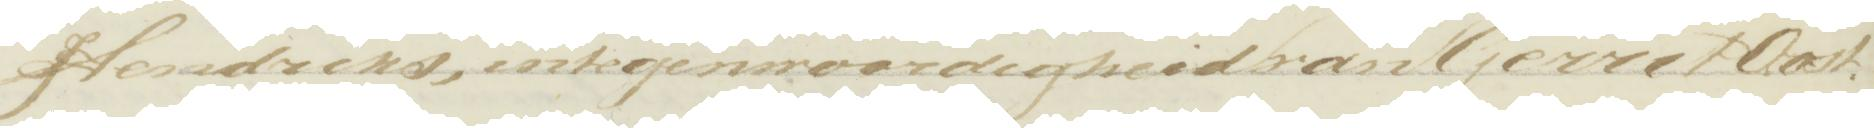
Hendriks in tegenwoordigheid van Gerrit Oost
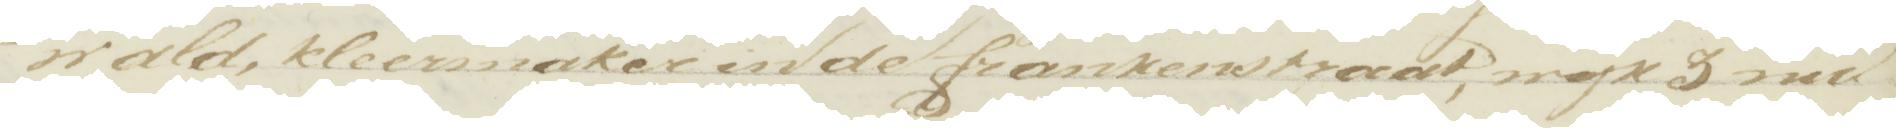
wald, kleermaker in de frankenstraat, wyk 3 nu
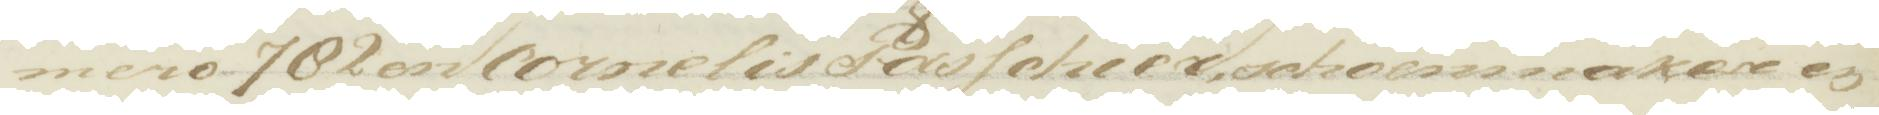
mero 782 en Cornelis Passcheer schoenmaker en
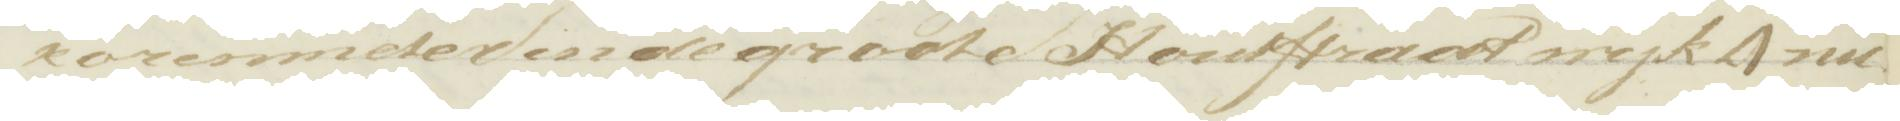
korenmeter in de groote Houtstraat wyk 4 nu
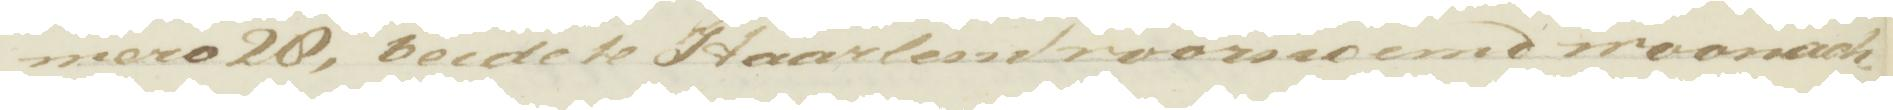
mero 28, beide te Haarlem voornoemd woonach
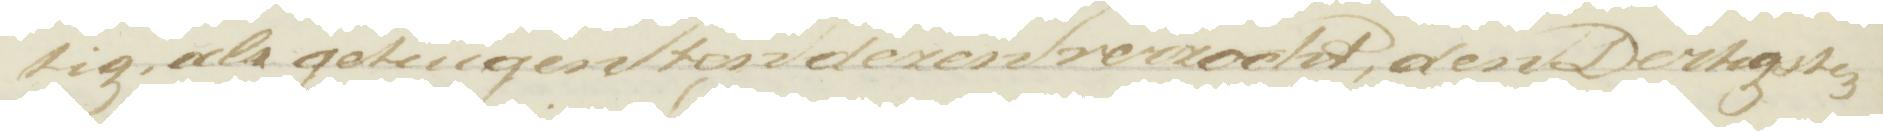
tig, als getuigen ten dezen verzocht, den Dertigsten
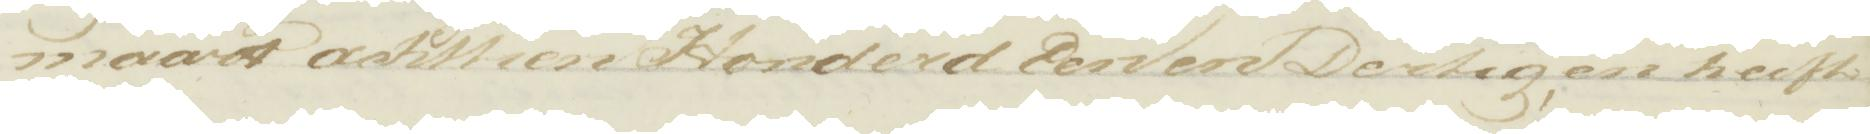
maart achttien Honderd een en Dertig en heeft
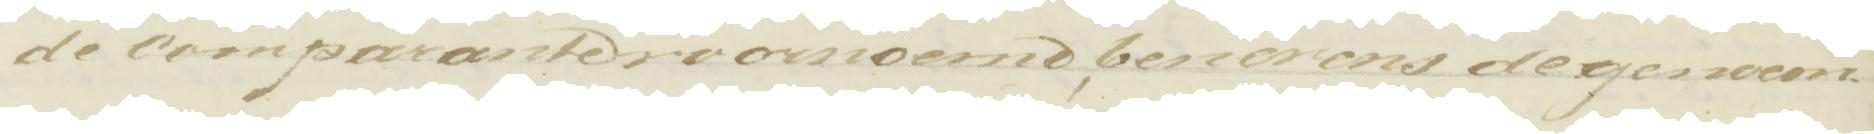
de comparante voornoemd benevens de genoem
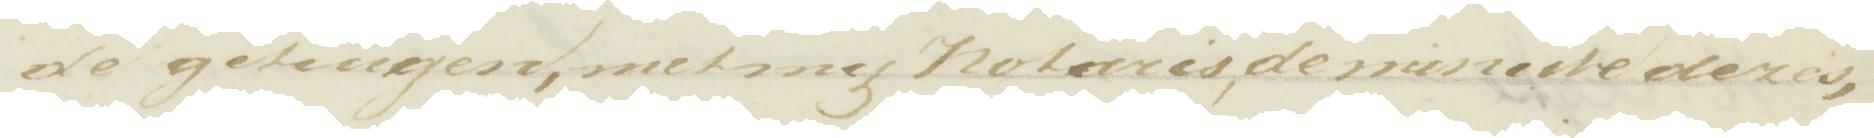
de getuigen, met my Notaris, de minute dezes,
